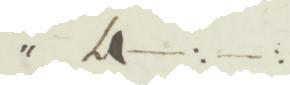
„ 4 —: —:
